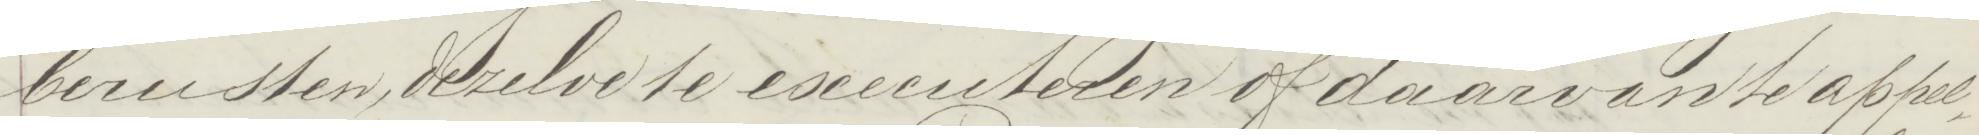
berusten, dezelve te executeren of daarvan te appel„
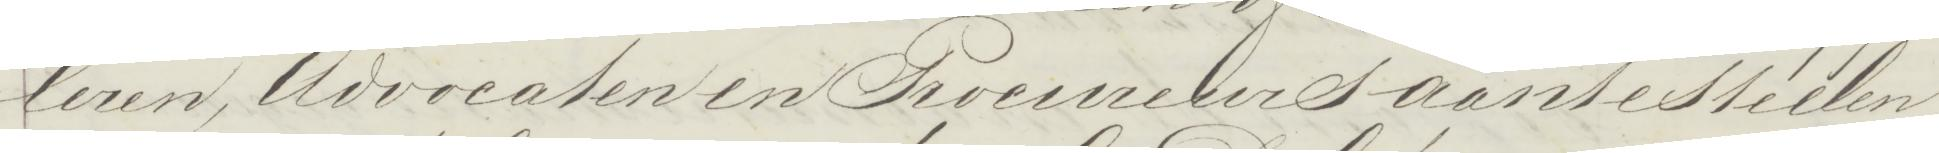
leren, Advocaten en Procureurs aan te stellen
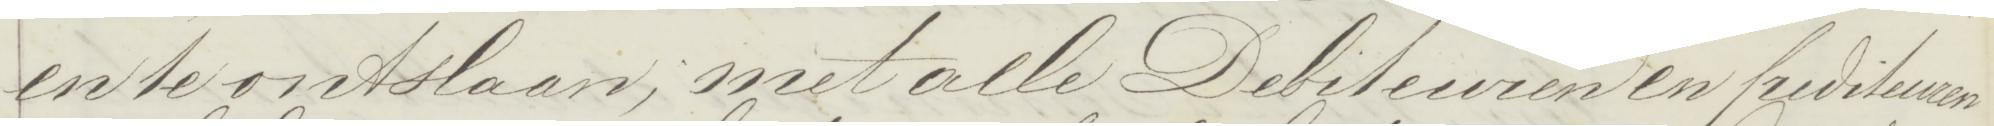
en te ontslaan; met alle Debiteuren en Crediteuren
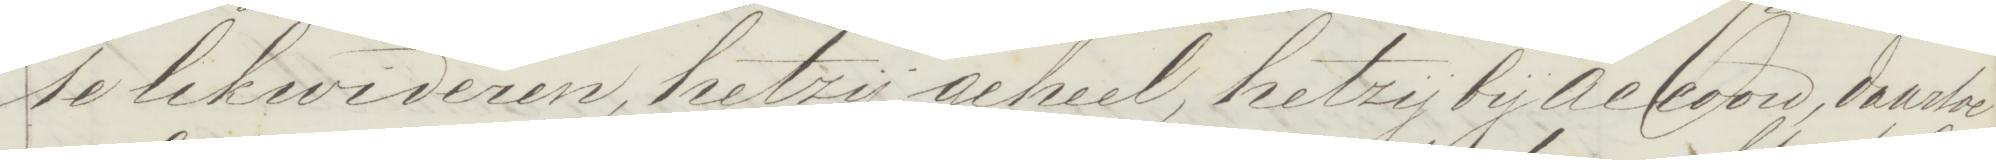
te likwideren, hetzij geheel, hetzij bij accoord, daartoe
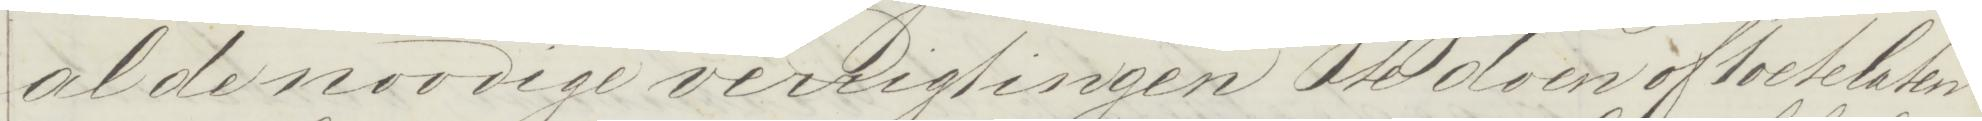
al de noodige verrigtingen te doen of toe te laten
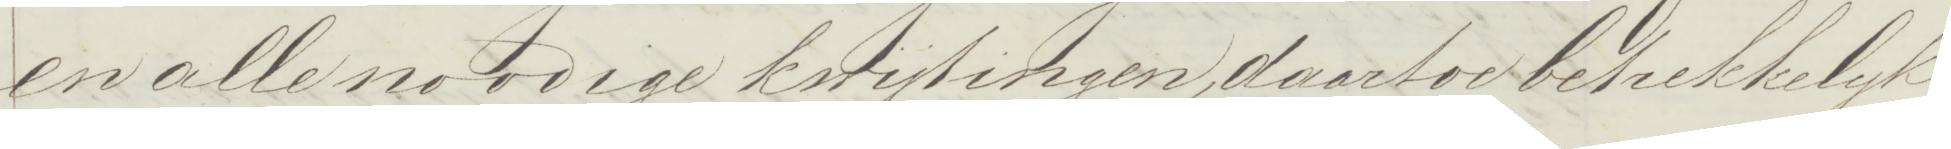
en alle noodige kwijtingen, daartoe betrekkelyk
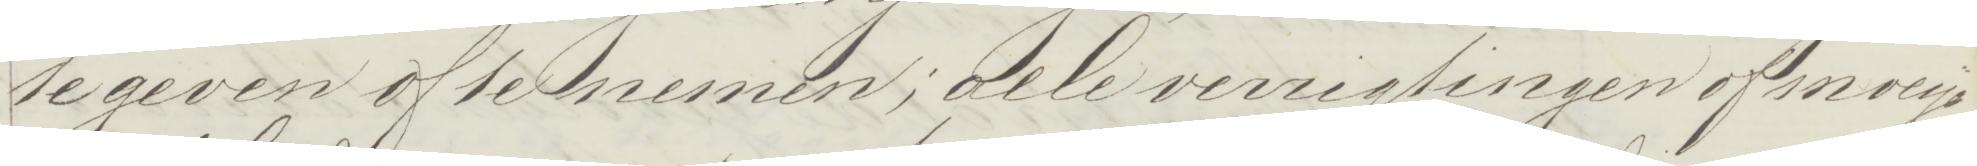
te geven of te nemen; alle verrigtingen of moeij„
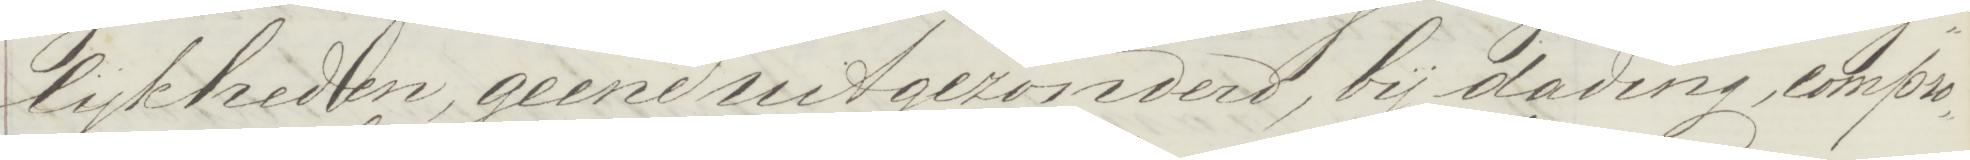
lijkheden, geene uitgezonderd, bij dading, compro„
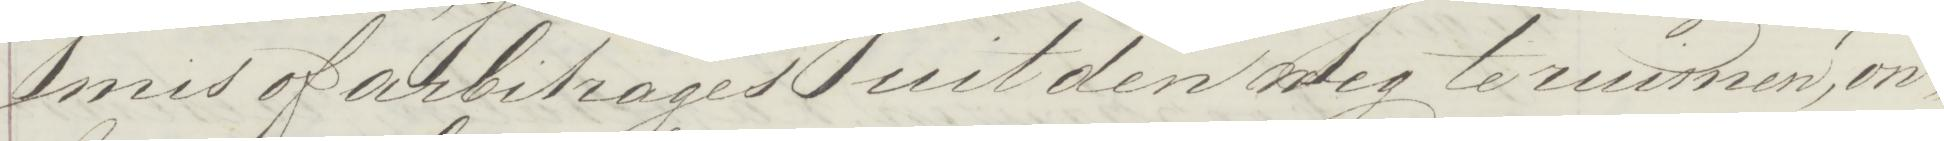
mis of arbitrages uit den weg te ruimen, on„
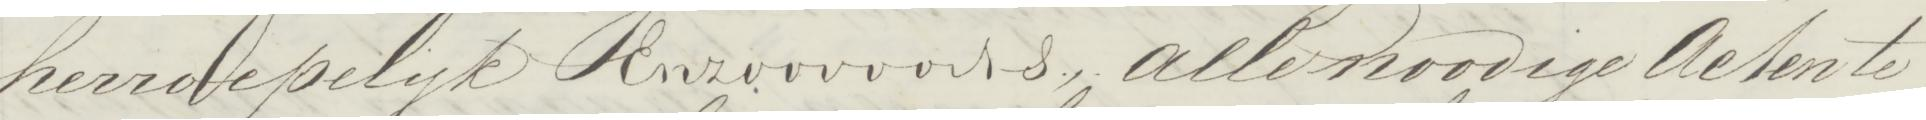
herroepelijk Enzoovoors„ alle noodige Acten te
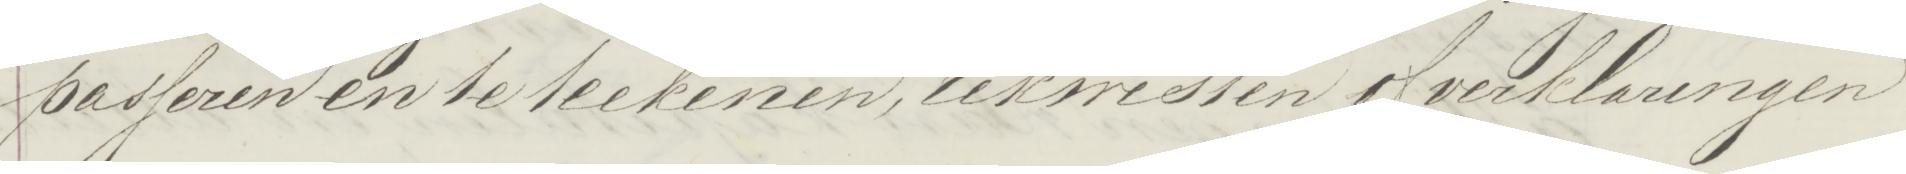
passeren en te teekenen, rekwesten of verklaringen
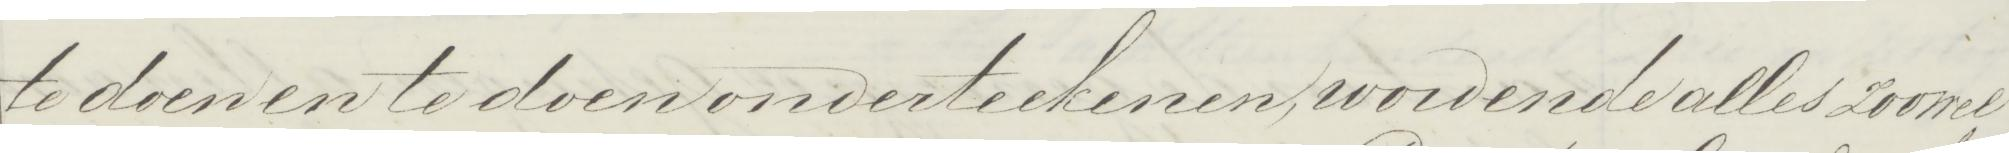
te doen en te doen onderteekenen, wordende alles zoo wel
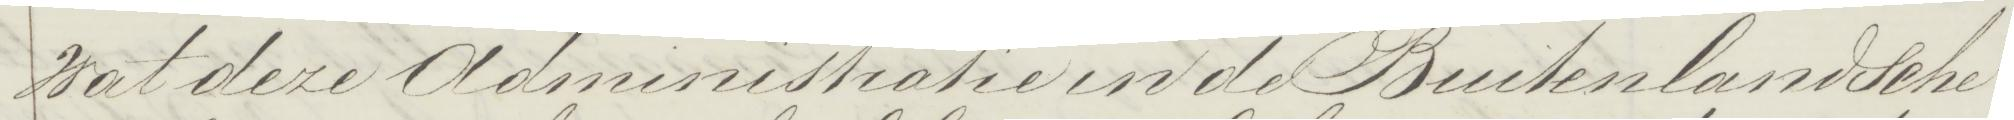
Wat deze Administratie in de Buitenlandsche
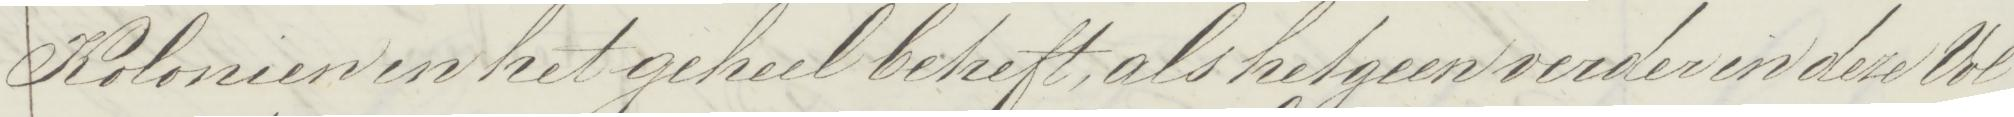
Kolonien en het geheel betreft, als het geen verder in deze Vol
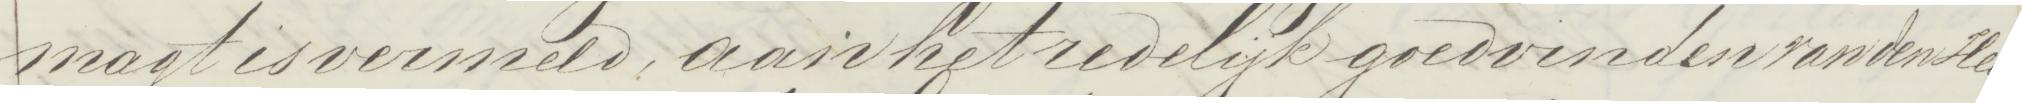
magt is vermeld; aan het redelijk goedvinden van den Heer
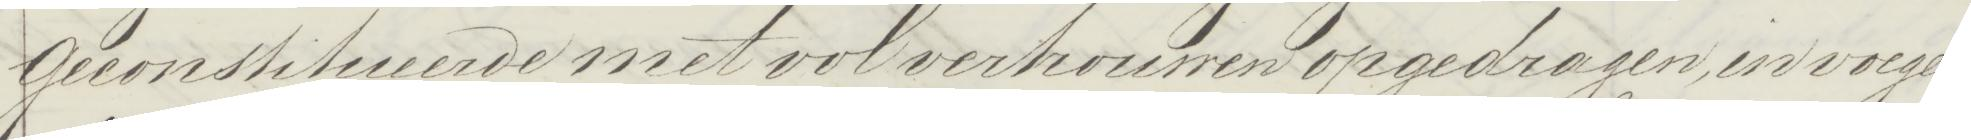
Geconstitueerde met vol vertrouwen opgedragen, in voege,
